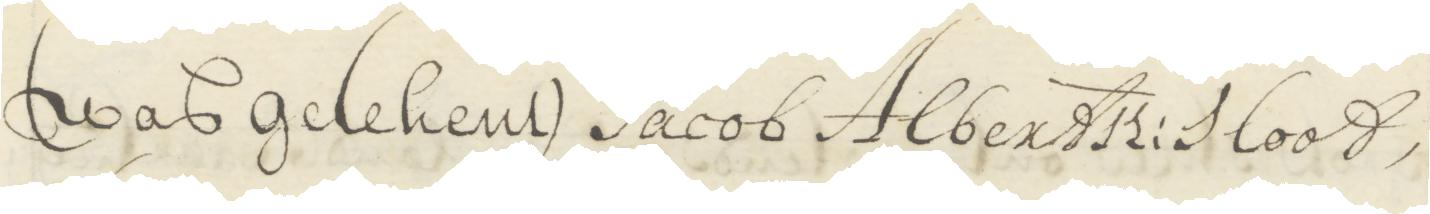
(was getekent) Iacob Albertsz: sloot,
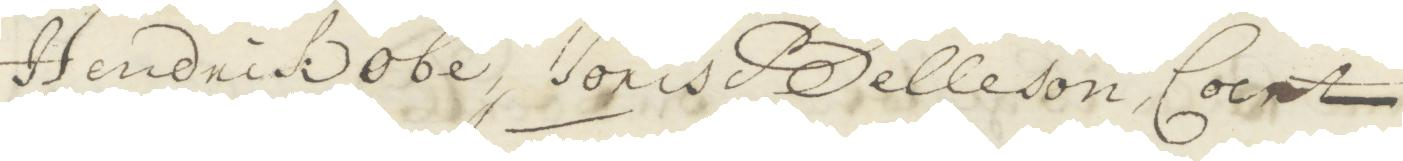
Hendrik obe, Ioris Belleson, Coert
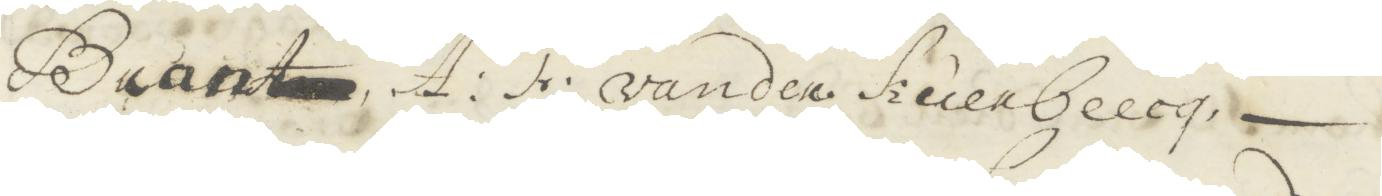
Brant, A: F: van der kuerbeecq, —
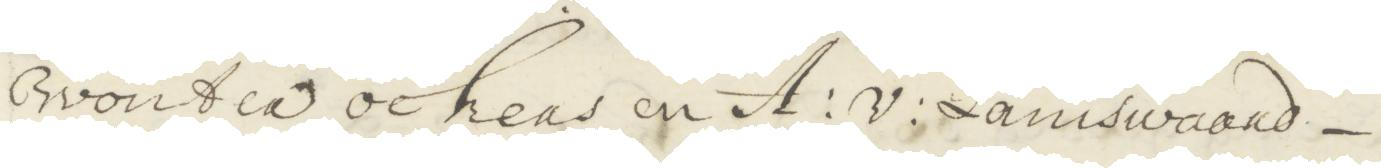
wouter ockers en A: v: Lamswaard —
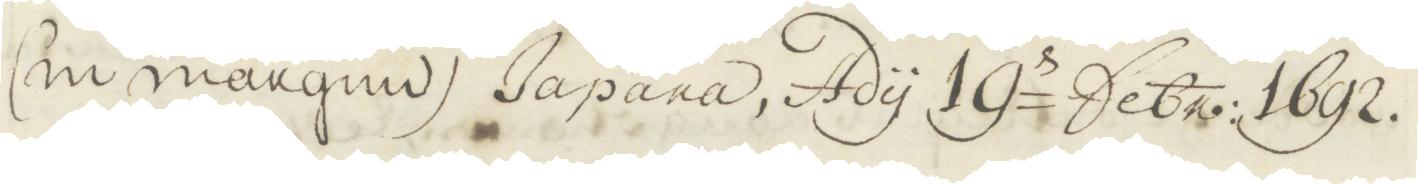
(in margine) Iapara, Adij 19=en febr: 1692.
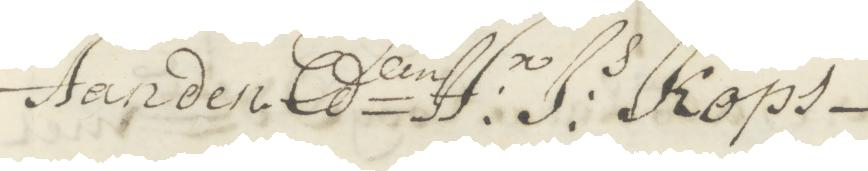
Aan den Ed=len H:r I:s kops —
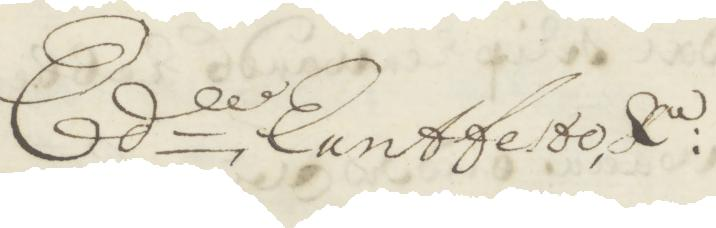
Ed=le Erntfeste, &:a
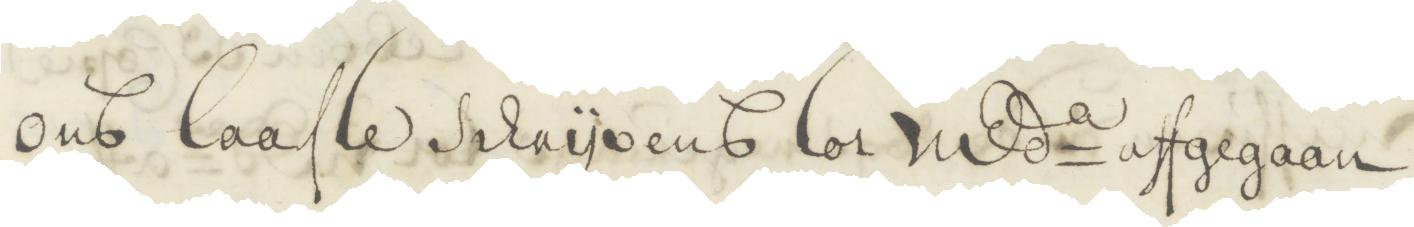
ons laaste schrijvens tot uEd=a affgegaan
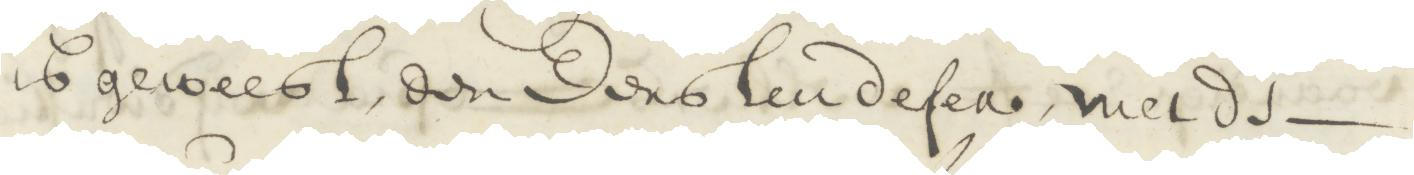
is geweest, den Eersten deser, met de —
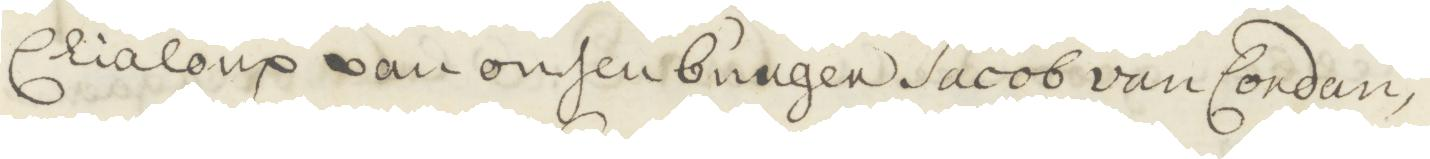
Chialoup van onsen burger Jacob van Cordan,
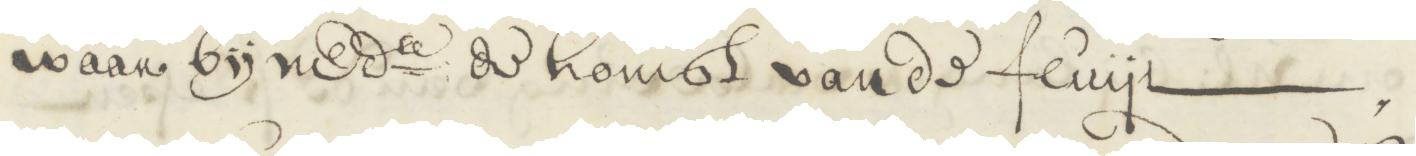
waar bij uEd=le de komst van de fluijt,
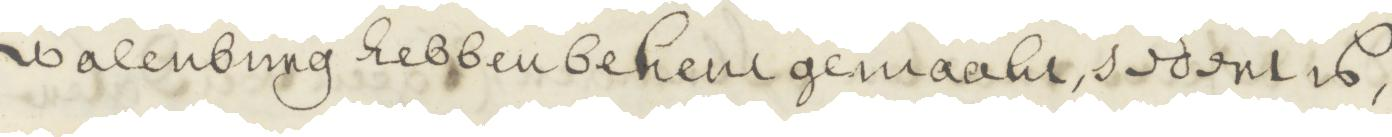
walenburg hebben bekent gemaakt, sedert is,
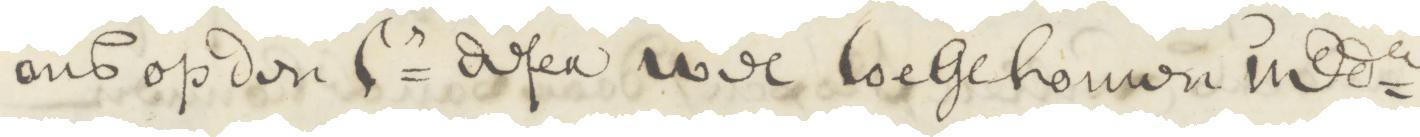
ons op den 5=en deser wel toegekomen uEd=le
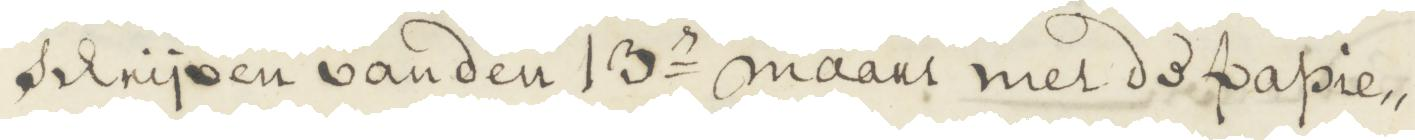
schrijven van den 13=en maart met de papie„
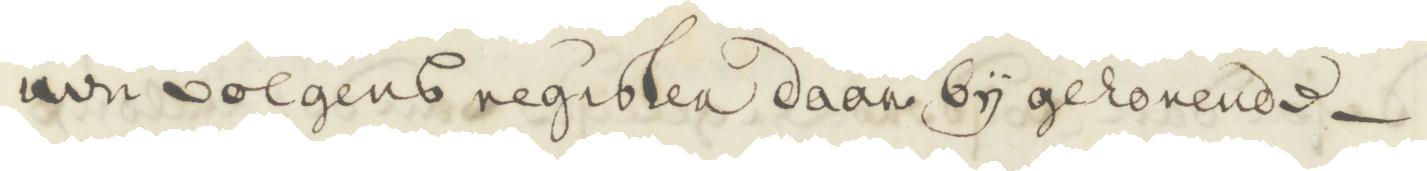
ren volgens register daar bij gehorende —
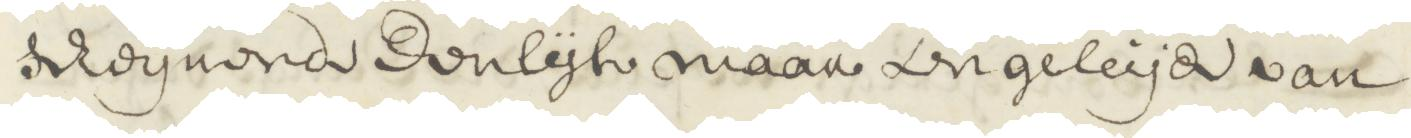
scheijnende Eenlijk maar ten geleijde van
